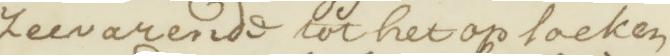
zeevarende tot het op soeken
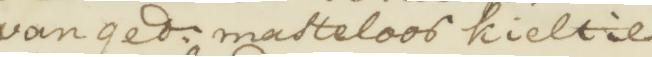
van ged. masteloos kieltie
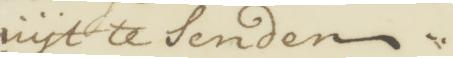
uijt te senden.
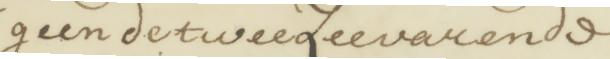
't geen de twee zeevarende
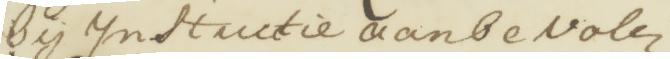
bij Jnstructie aanbevolen
